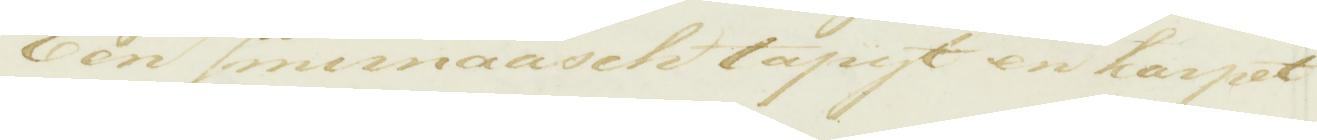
Een Smirnaasch tapijt en karpet
